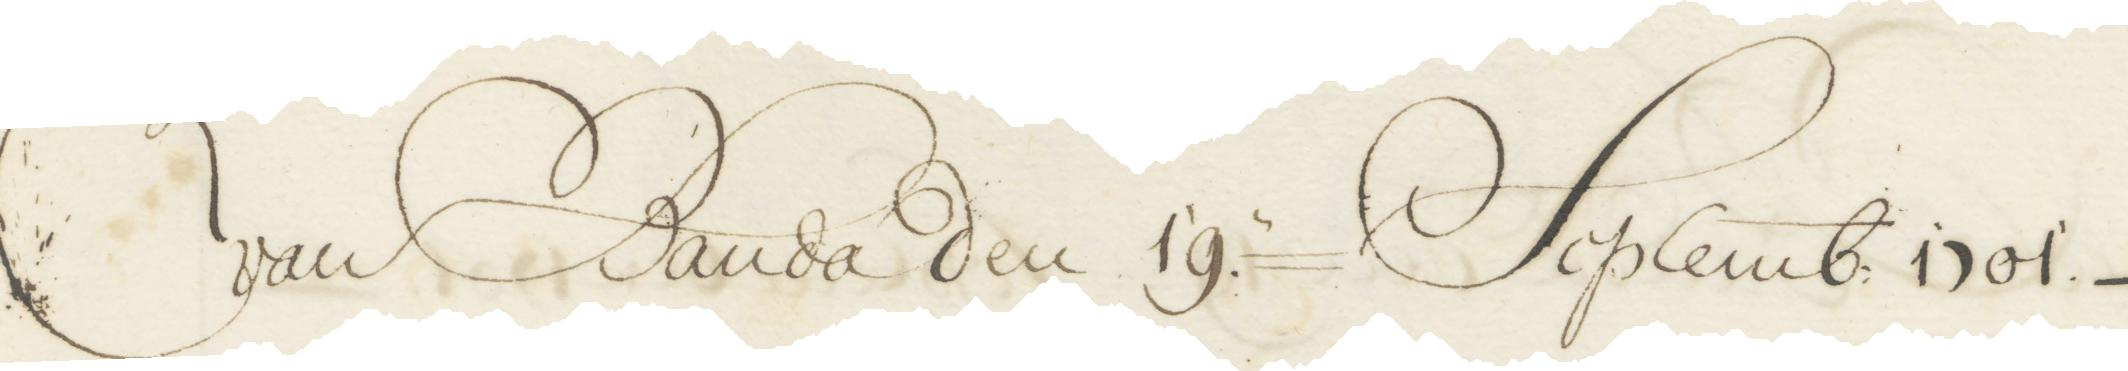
Van Banda den 19:=n Septemb: 1701.
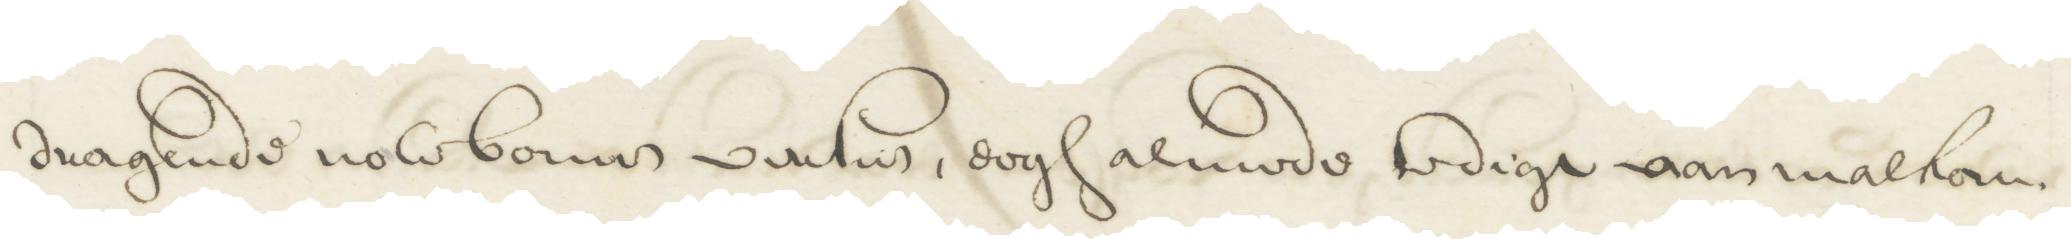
dragende notebomen versien, dogh almede tedigt van malkan.
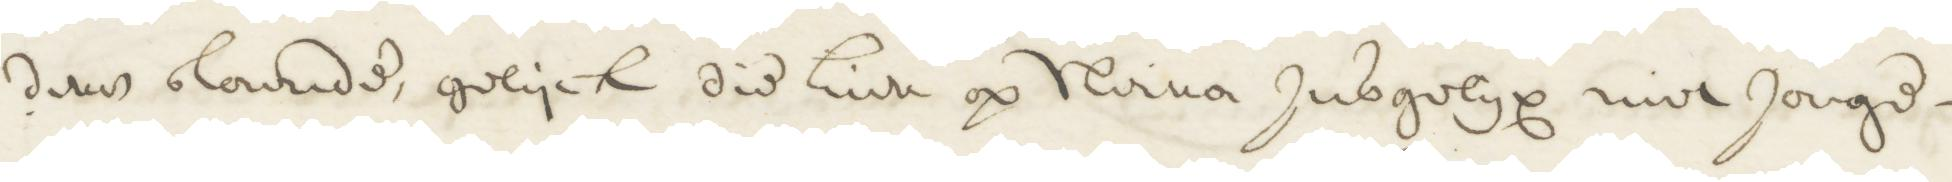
.deren staende, gelijck die hier op Neira jnsgelijx niet jonge
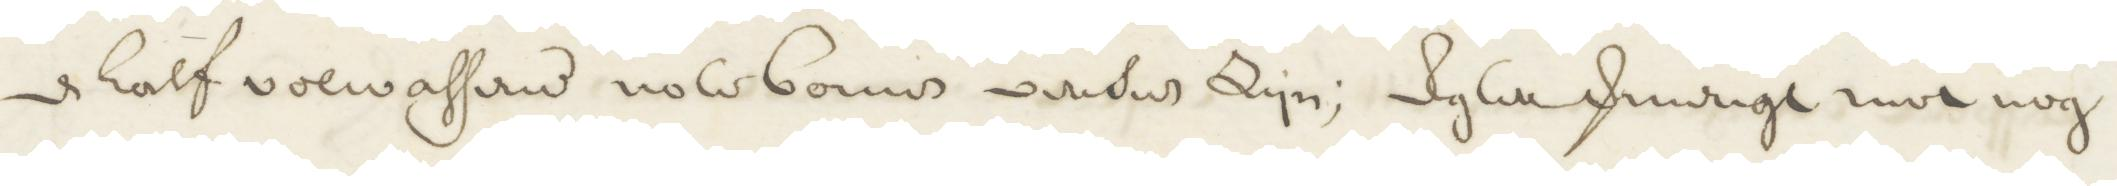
en half volwassene note bomen versien zijn; Egter vermengt met nog
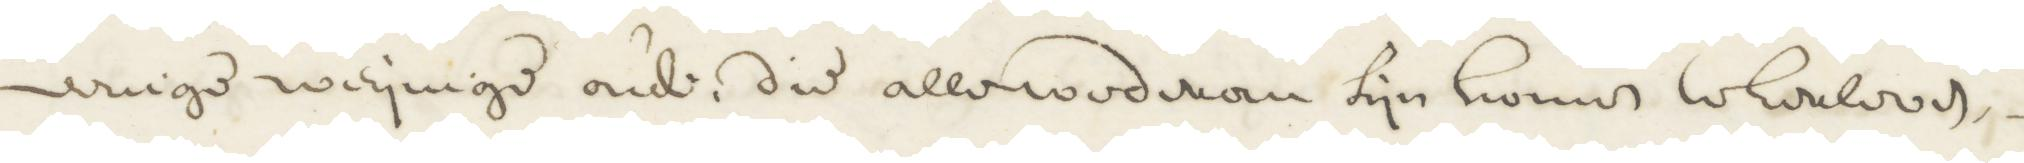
eenige weijnige oude, die alle wederom sijn komen te herleven,
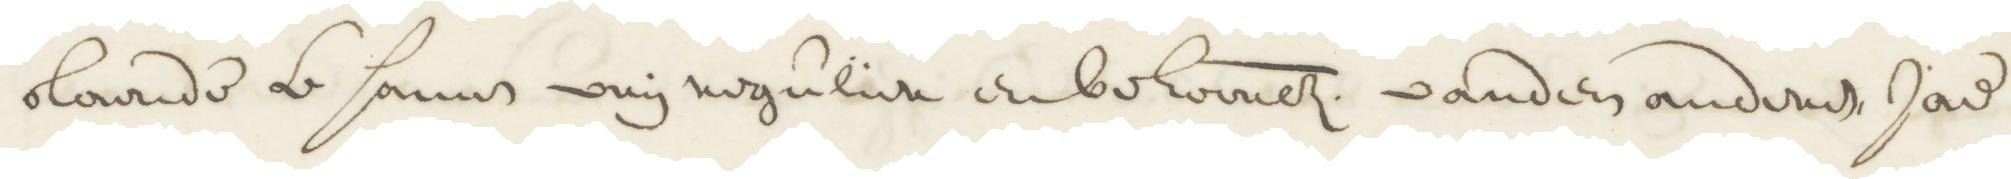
slaende te samen vrij regulier en behoorlijk vanden anderen, jae
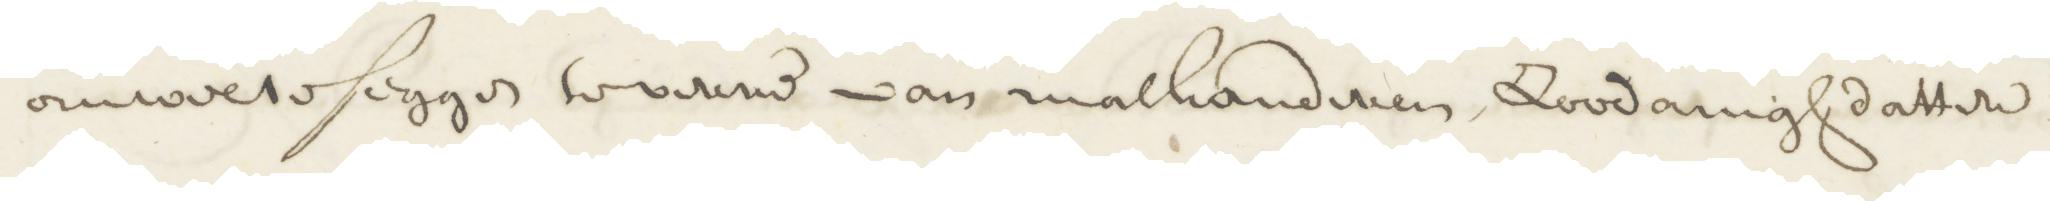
om welte seggen teverre van malkanderen, zoodanigh datter
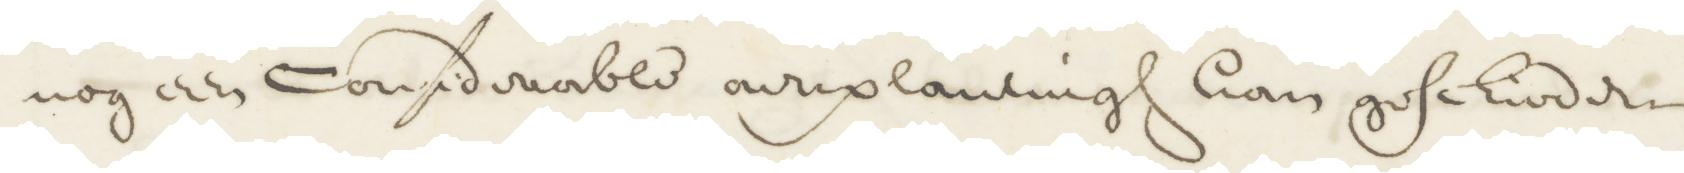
nog een considerable aenplantingh kan geschieden
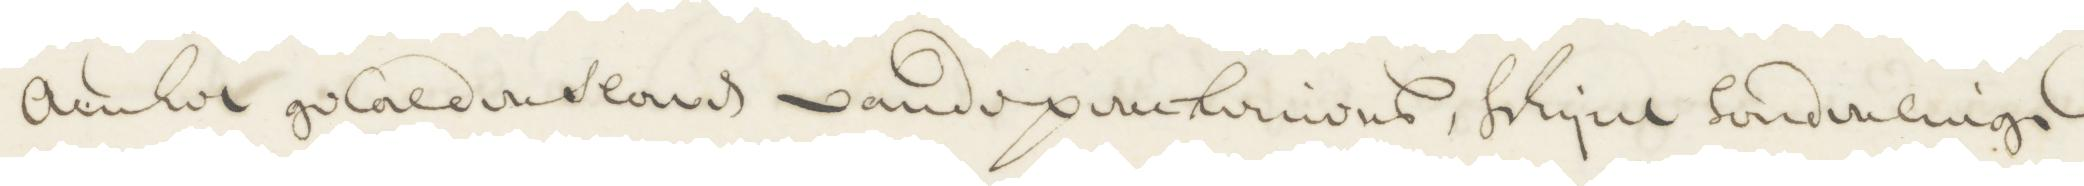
Aen het getal der slaven van de perckeniers, schijnt sonderlinge
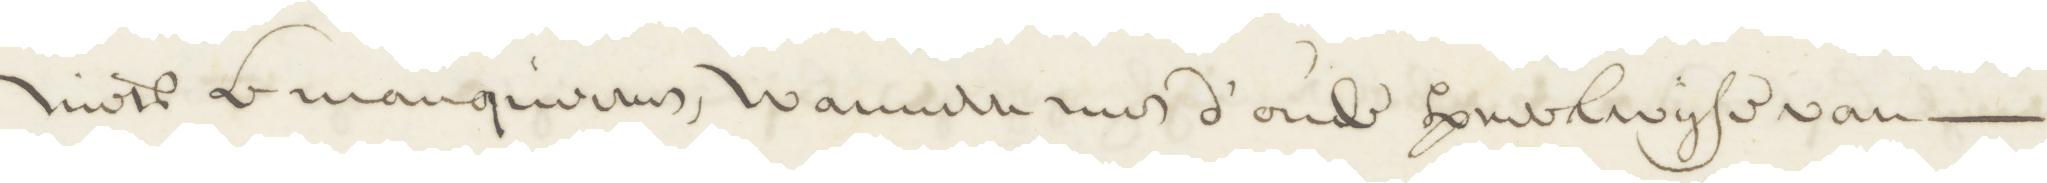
niets te manqueeren, wanneer men d’ oude spreekwijse van —
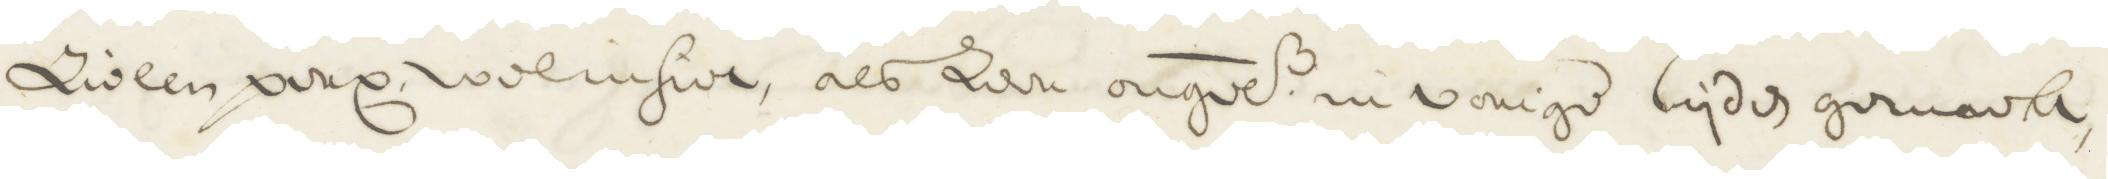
zielen perx, wel insiet, als zeer ongelijk in vorige tijden geraekt,
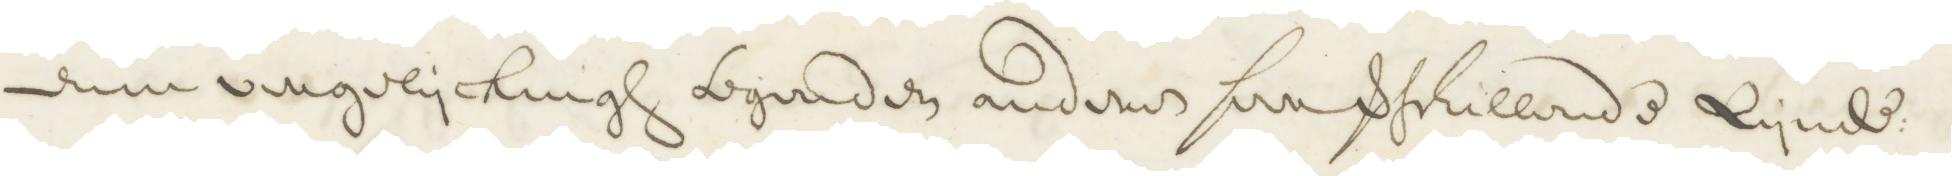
en in vergelijckingh tegen den anderen seer verschillende zijnde:
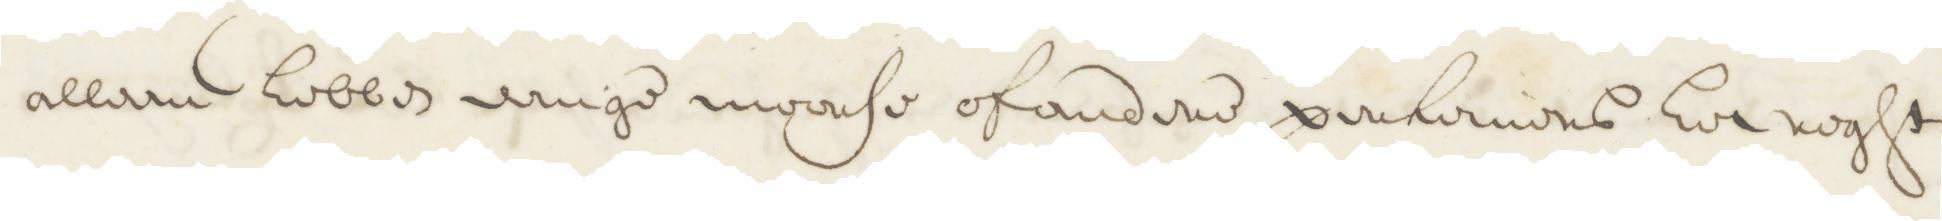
alleene hebben eenige moorse of andere perkeniers het reght
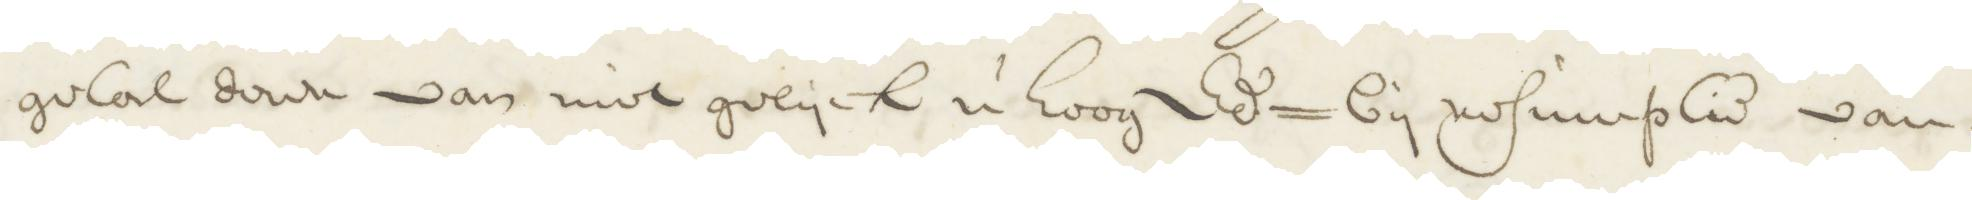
getal daer van niet gelijck u hoog Ed= bij resumptie van
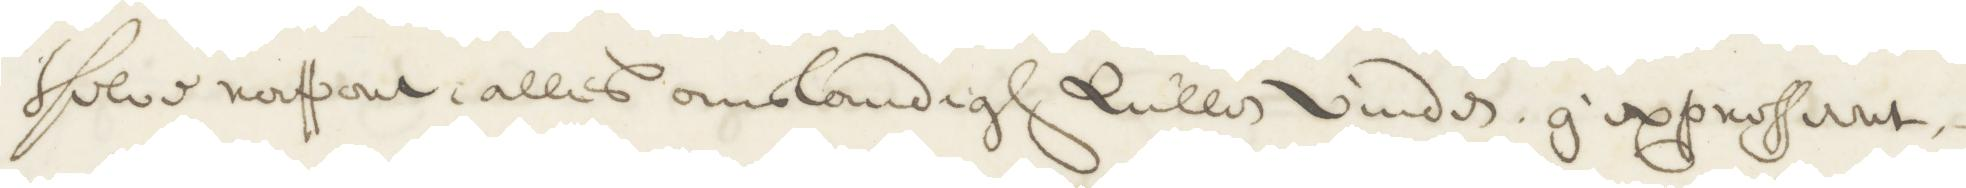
'tselve rapport, alles omstandigh zullen vinden. g’expresseert,
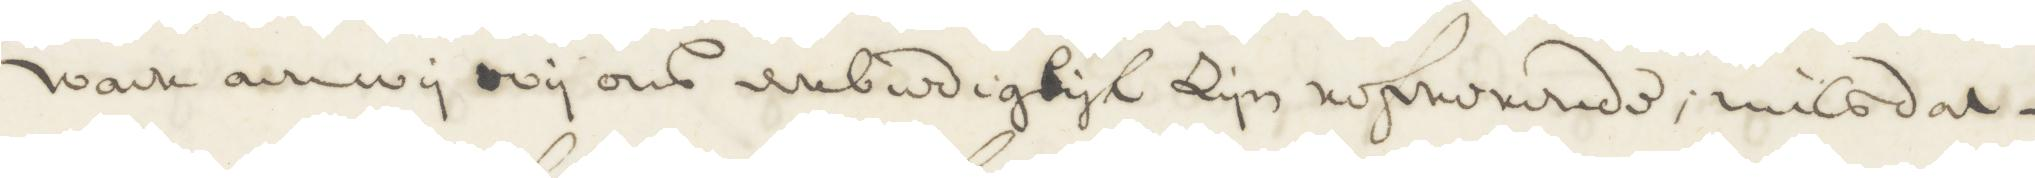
waer aen wij wij ons eerbiediglijk zijn refererende; mits dat
